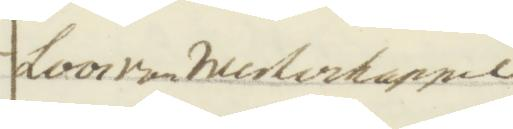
Loos van Westerkappel
